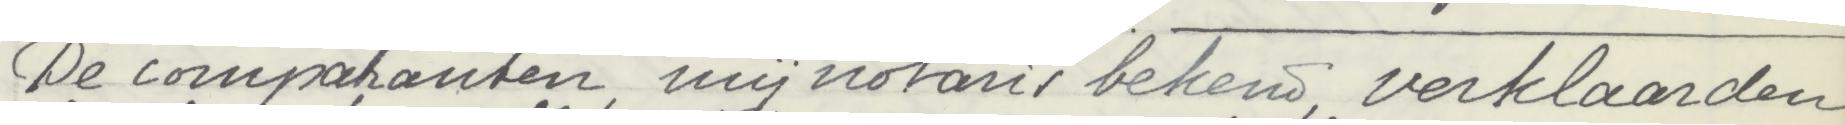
De comparanten, mij notaris bekend verklaarden
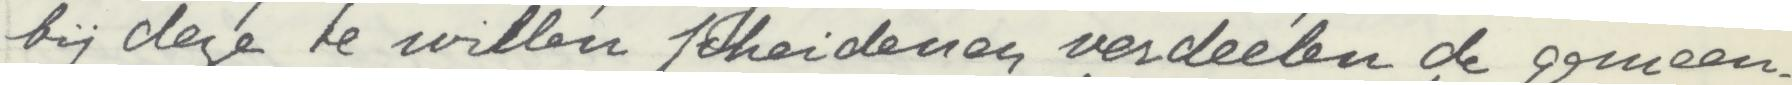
bij deze te willen scheiden en verdeelen de gemeen
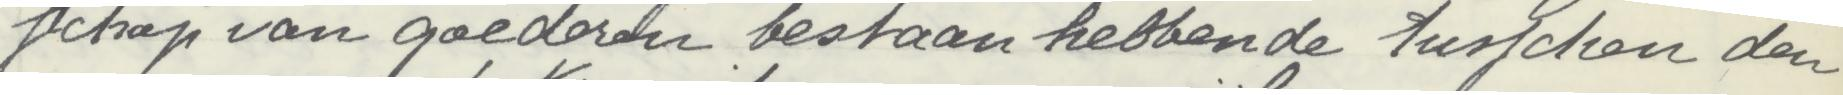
schap van goederen bestaan hebbende tusschen den
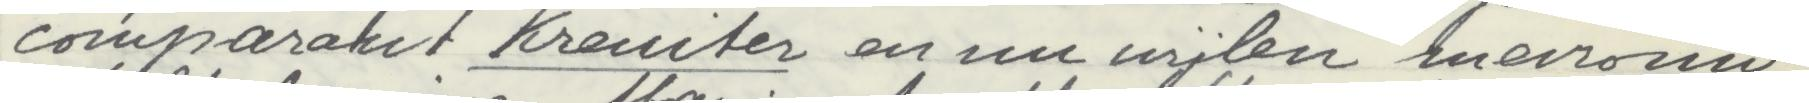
comparant kreuiter en nu wijlen mevrouw
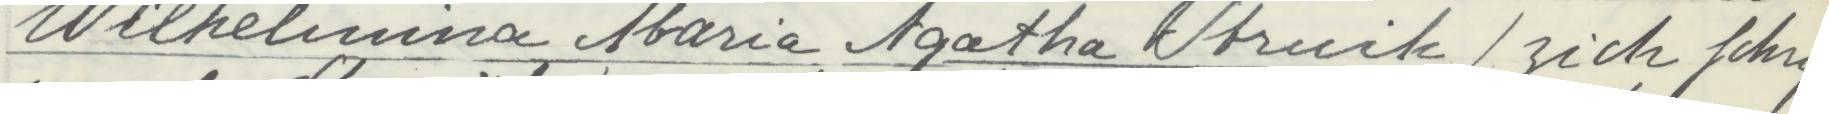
Wilhelmina Maria Agatha Struik / zich schrij
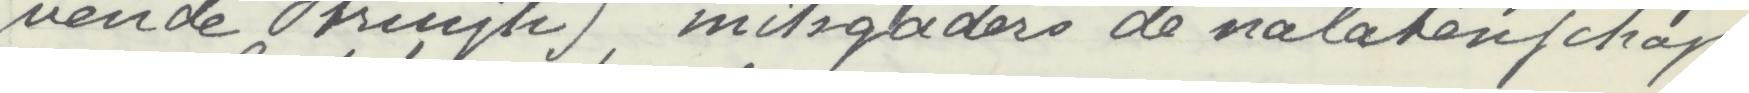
vende Struijk) mitsgaders de nalatenschap
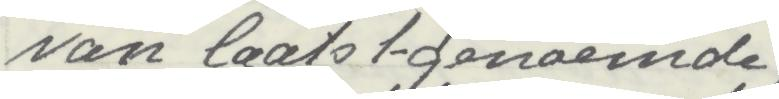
van laatst-genoemde
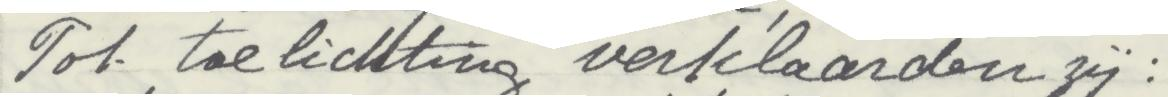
Tot toelichting verklaarden zij:
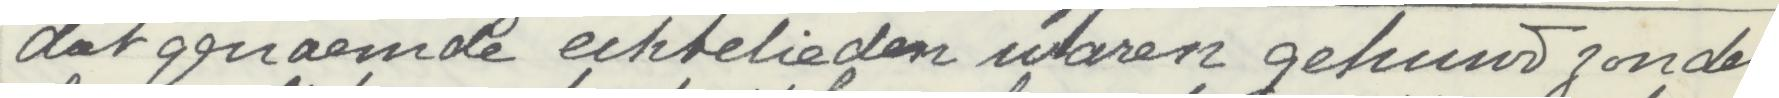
dat genoemde echtelieden waren gehuwd zonder
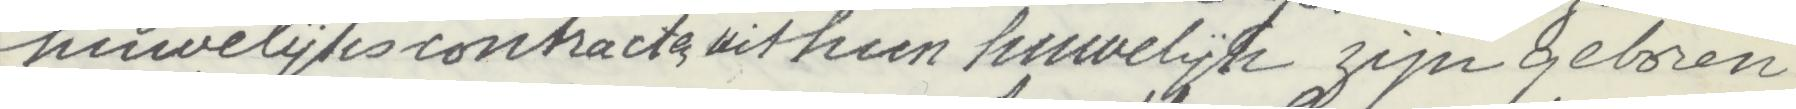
huwelijks contracten uit hun huwelijk zijn geboren
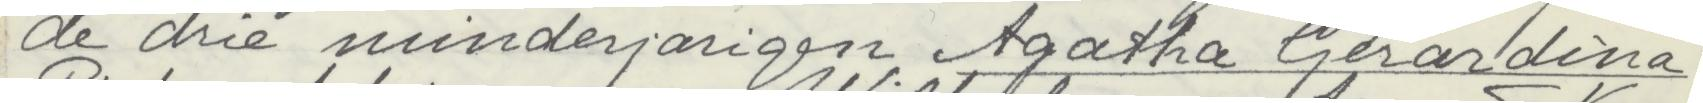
de drie minderjarigen Agatha Gerardina
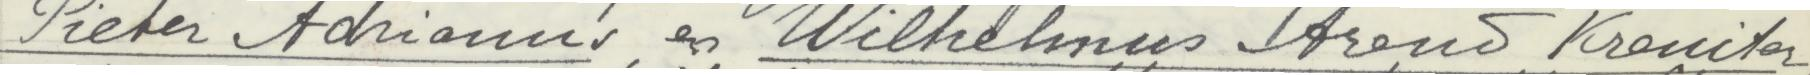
Pieter Adrianus en Wilhelmus Arend Kreuiter
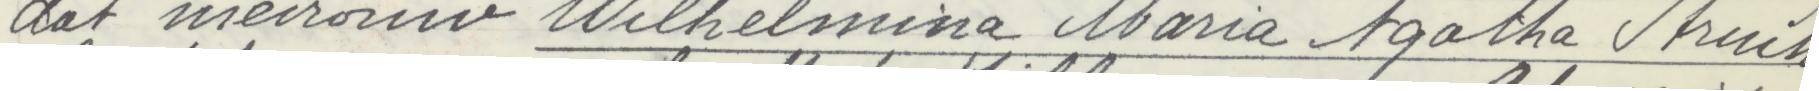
dat mevrouw Wilhelmina Maria Agatha Struik
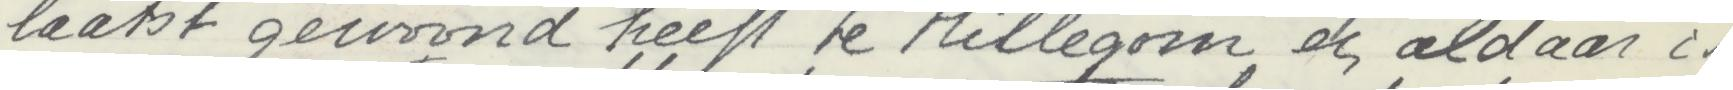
laatst gewoond heeft te Hillegom en aldaar is
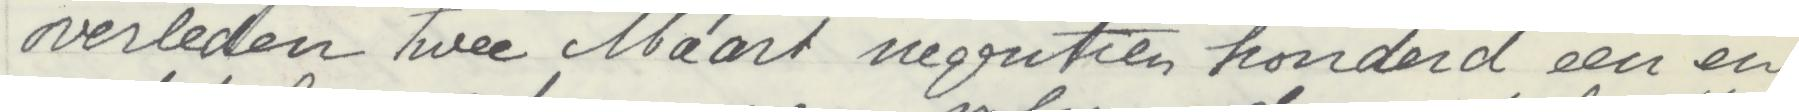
overleden twee Maart negentien honderd een en
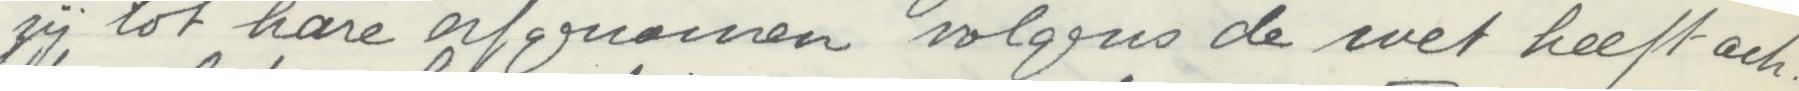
zij tot hare ergenamen volgens de wet heeft ach
